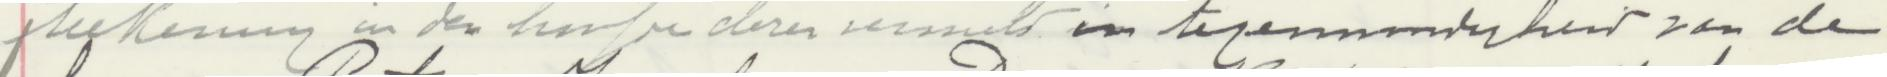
tiekermen in der hoofde dezer vermeld in tegenwoordigheid van de
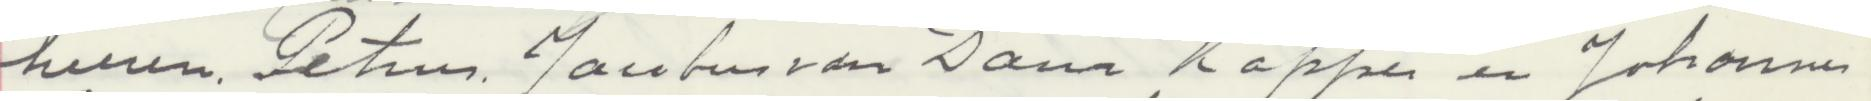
heeren. Petrus. Jacobus van Dam Kapper en Johannes
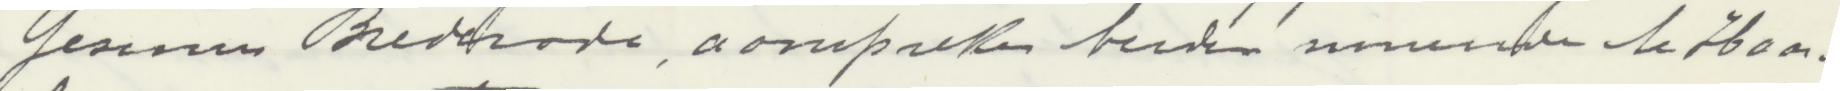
Gesinus Brederode, aanspreker beiden wonende te Haar-
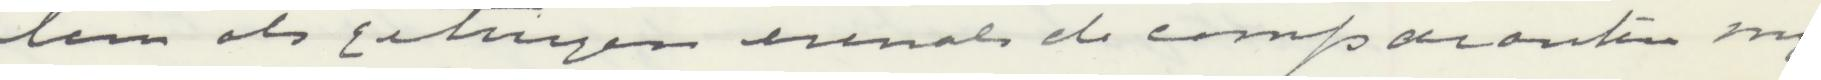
lem als getuigen evenals de comparanten mij
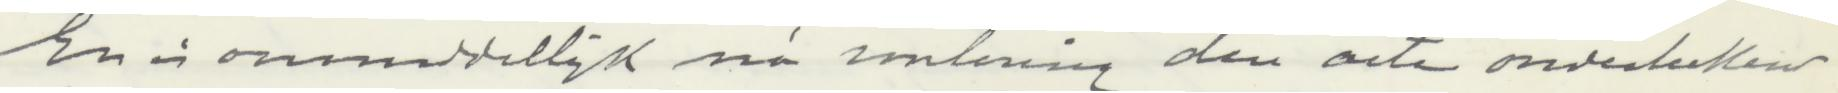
En is onmiddellijk na voorlezing deze acte onderteekend
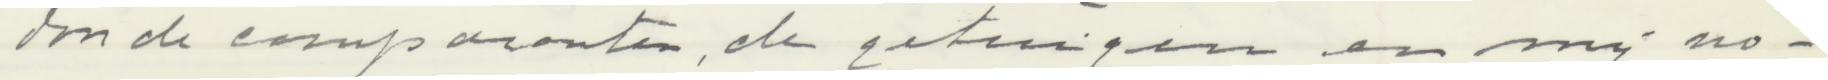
door de comparanten, de getuigen en mij no-
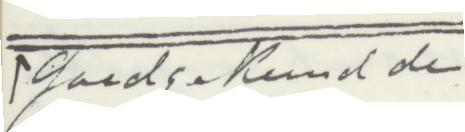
¶ goedgekeurd de
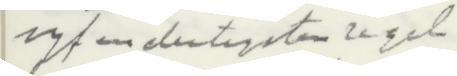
vyf en dertigsten regel
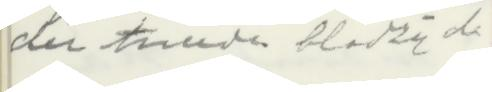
der tweede bladzijde
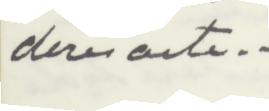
dezer acte.
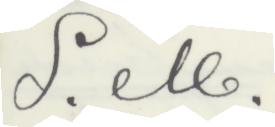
S. M.
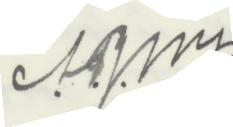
A.P.J.M.S
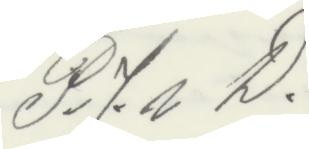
P.J. v D.
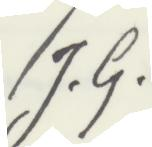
J. G.
